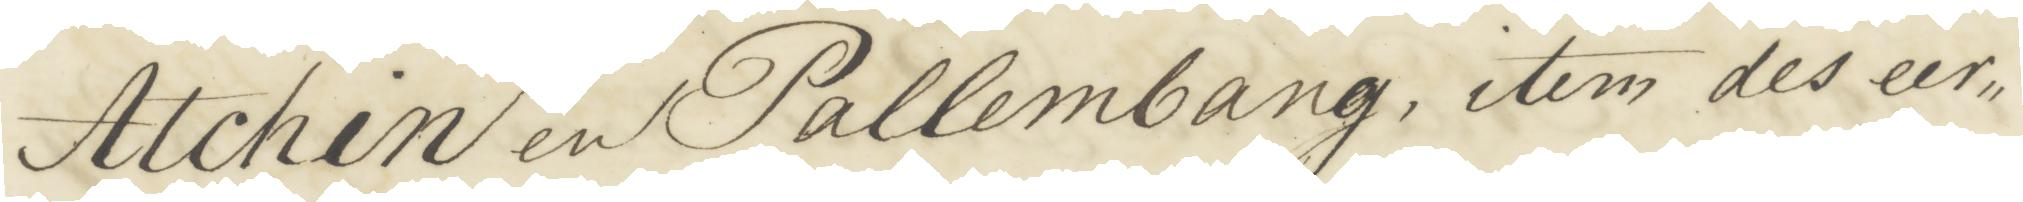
Atchin en Pallembang, item des eer„
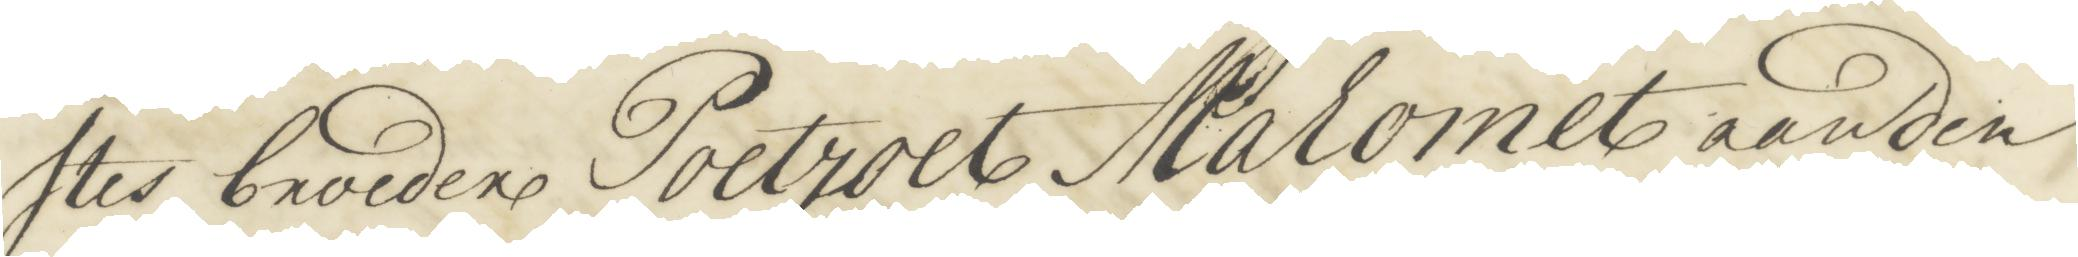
stes broeder Poetjoet Mahomet aan den
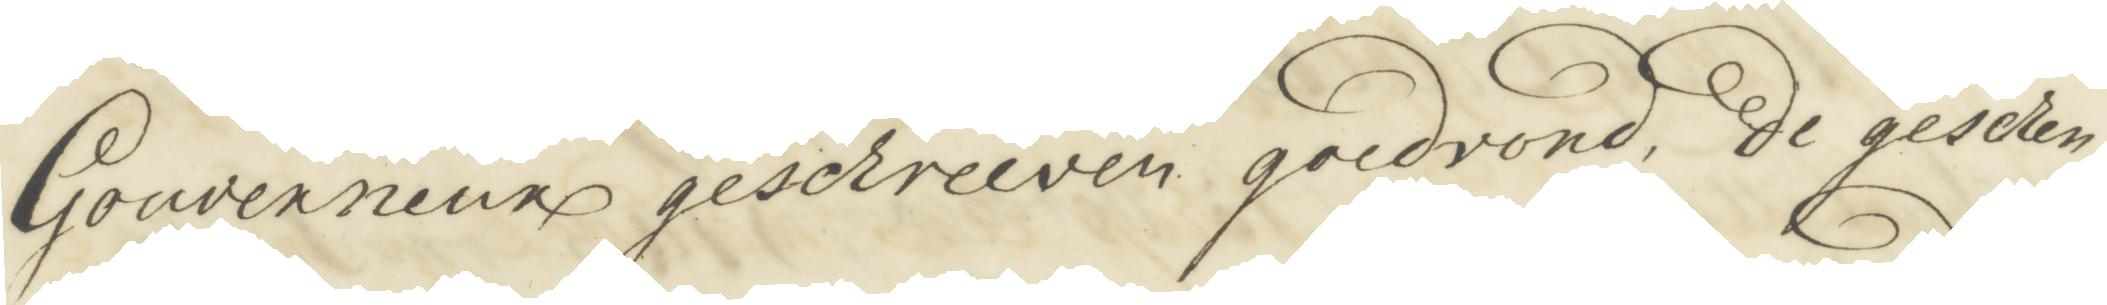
Gouverneur geschreeven goedvond, de geschen
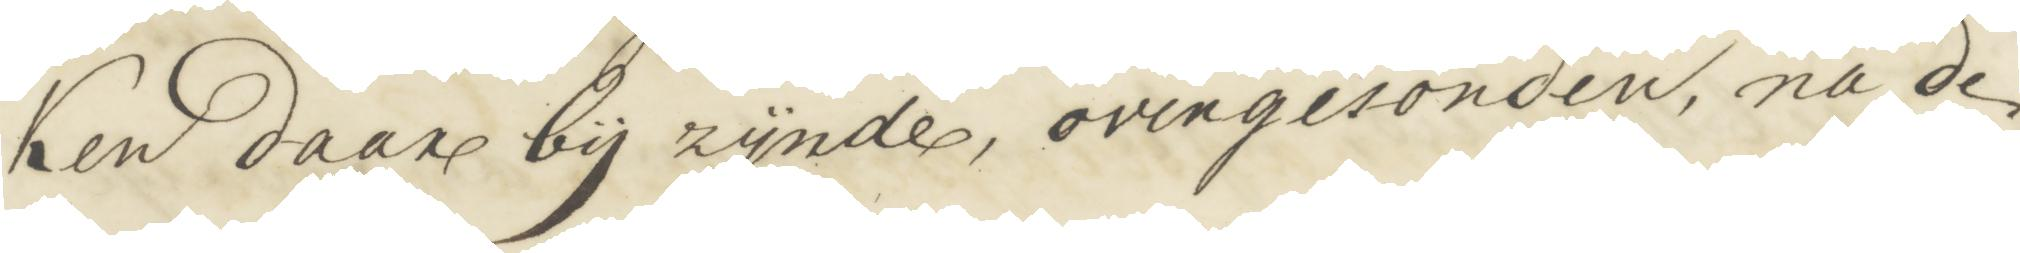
ken daar bij zijnde, overgesonden, na de
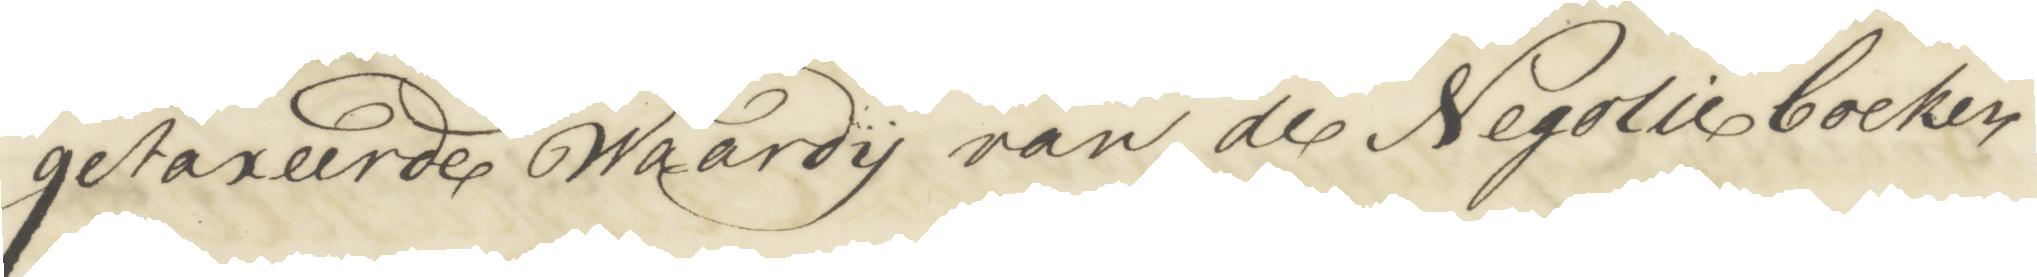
getaxeerde waardij van de Negotie boeken
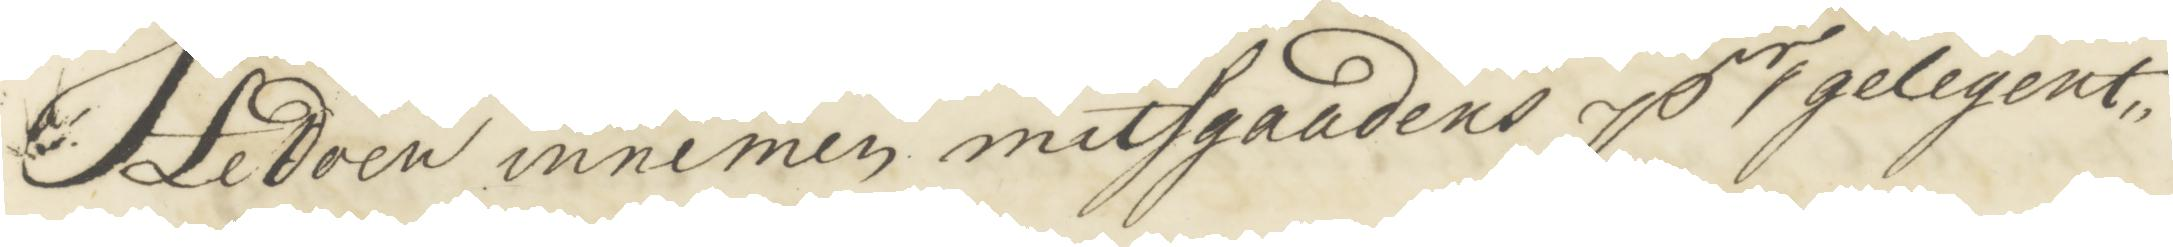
te doen innemen mitsgaaders p„r gelegent„
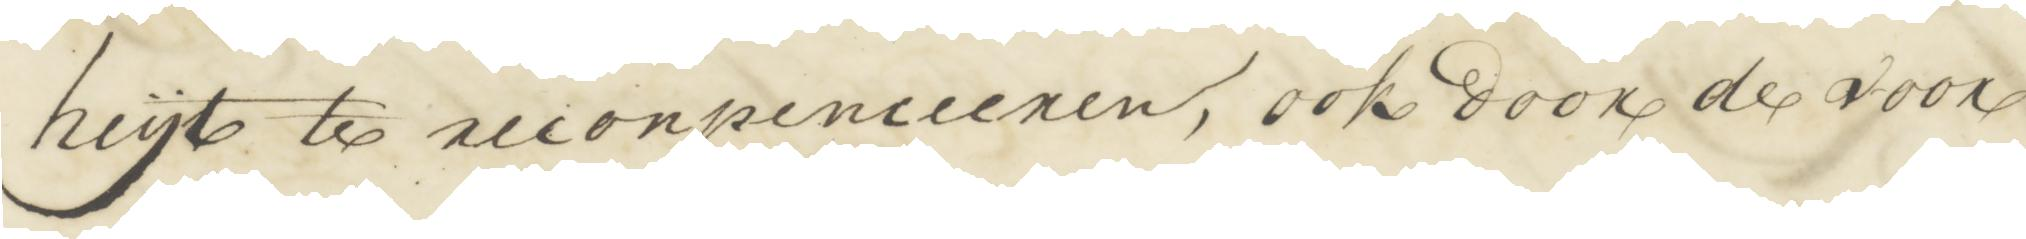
heijt te reconpenceeren, ook door de voor
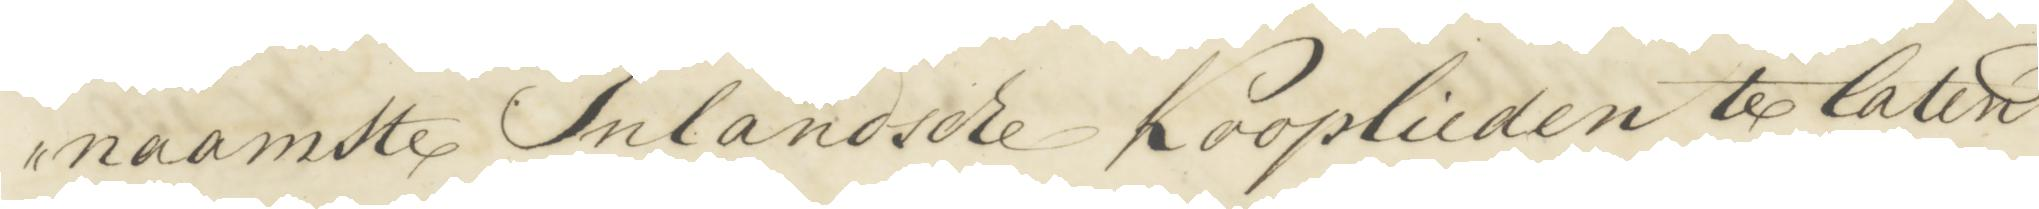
„naamste Inlandsche Kooplieden te laten
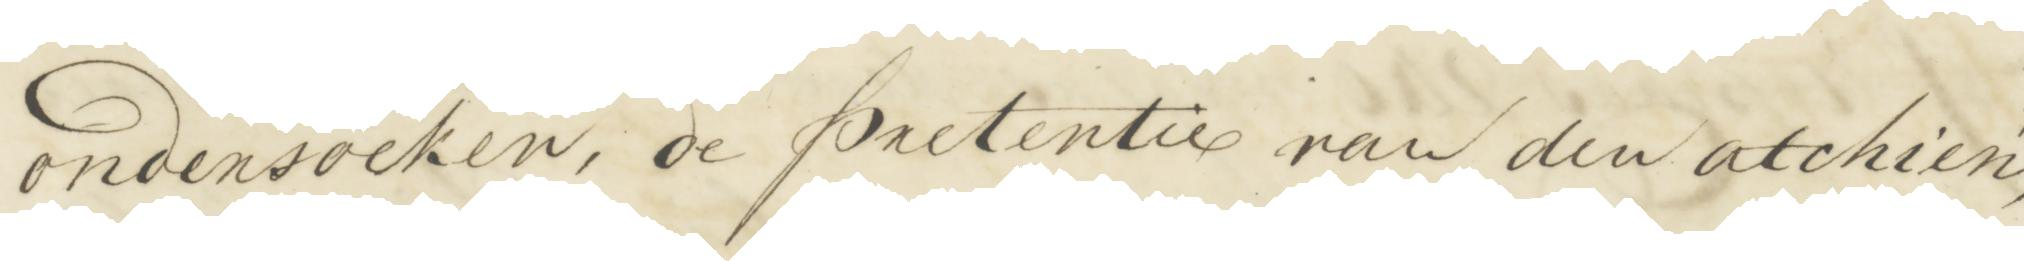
ondersoeken, de pretentie van den atchien
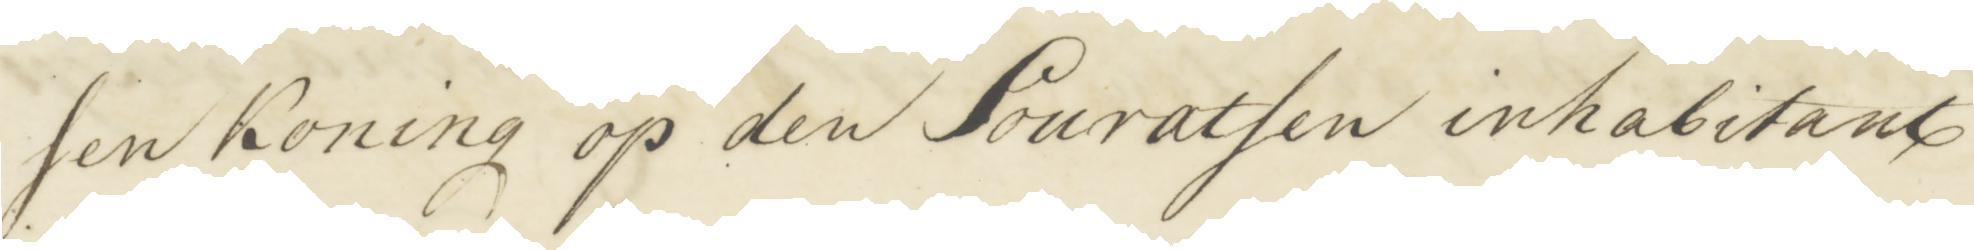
sen koning op den Souratsen inhabitant
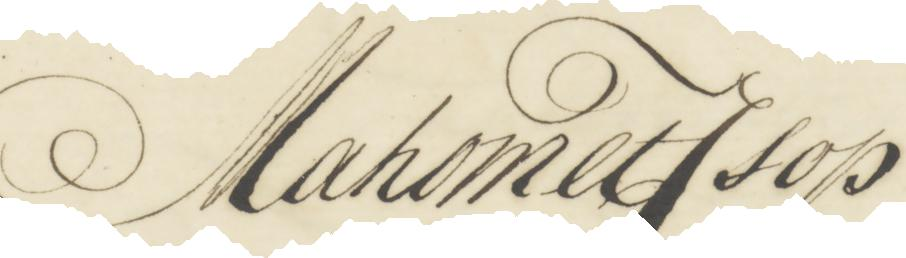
Mahomet Jsop
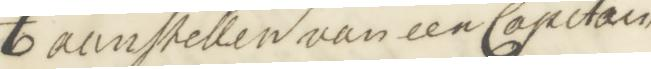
't aanstellen van een Capitain
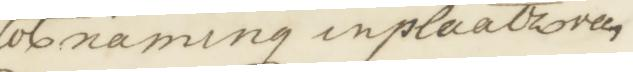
tot naming in plaatz van
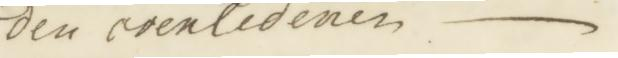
den overledenen —
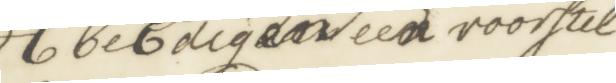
't beEdigden eed voorstel
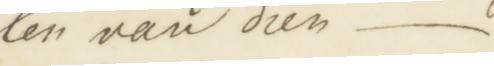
len van dien —
